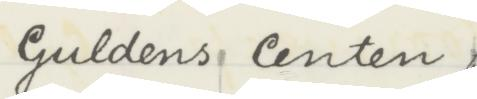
Guldens Centen
